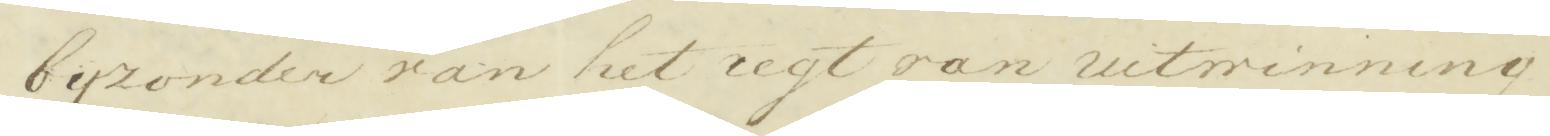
bijzonder van het regt van uitwinning
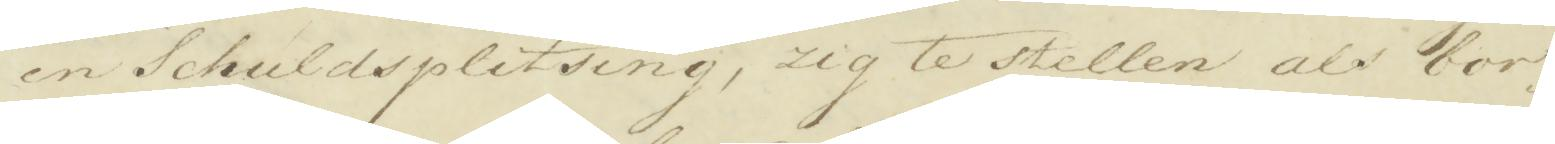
en schuldsplitsing, zig te stellen als bor„
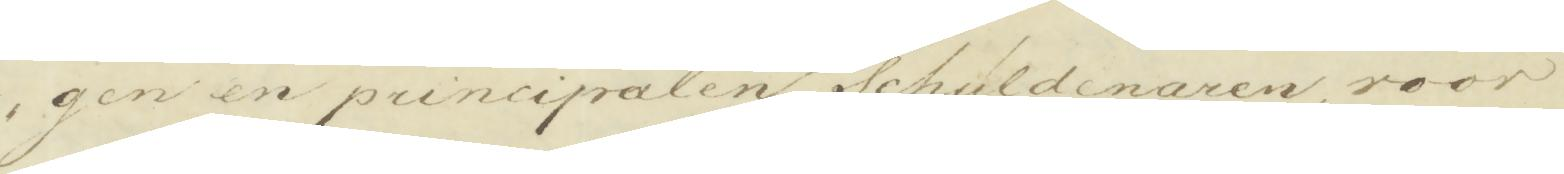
„gen en principalen schuldenaren, voor
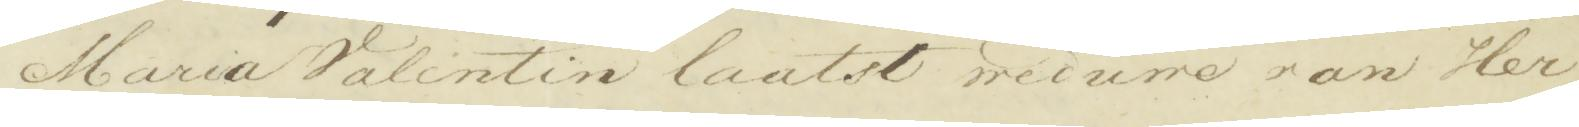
Maria Valentin laatst weduwe van Her
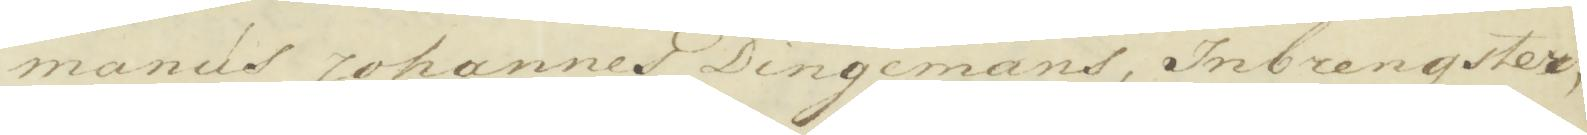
manus Johannes Dingemans, Inbrengster,
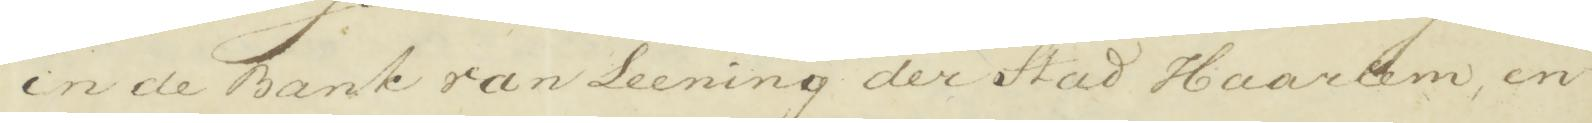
in de Bank van Leening der stad Haarlem, en
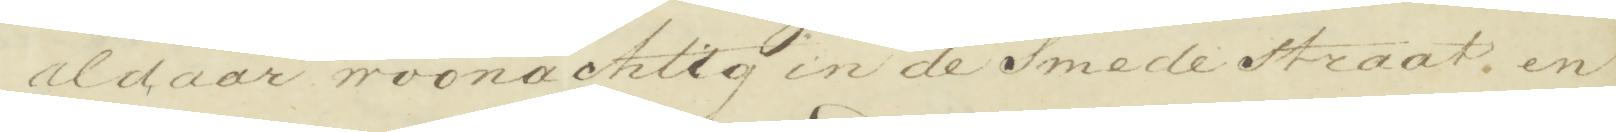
aldaar woonachtig in de smede straat, en
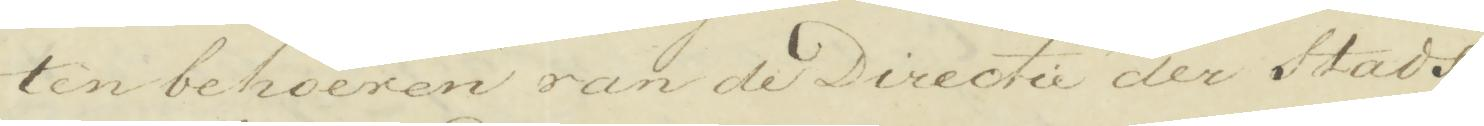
ten behoeven van de Directie der Stads
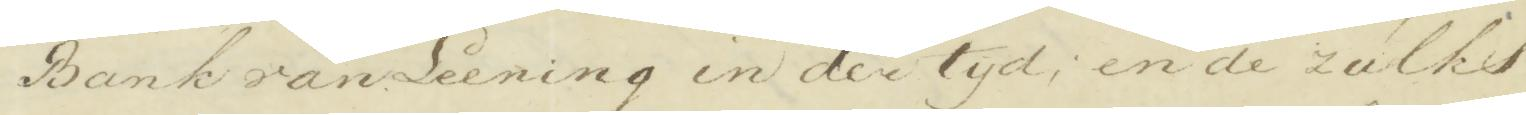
Bank van Leening in der tijd; en de zulks
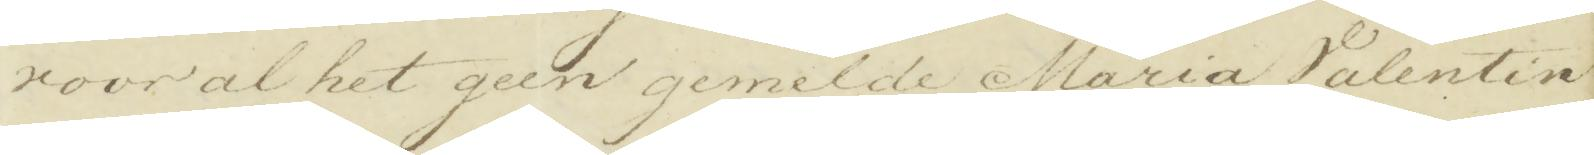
voor al het geen gemelde Maria Valentin
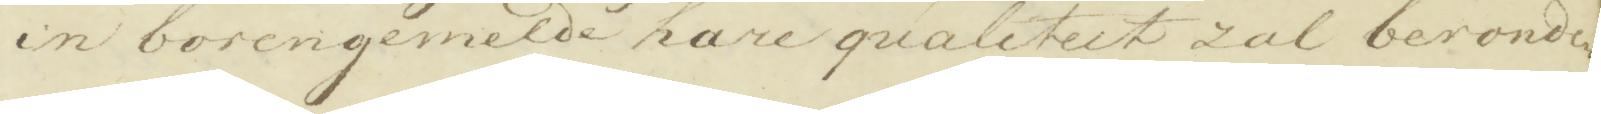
in bovengemelde hare qualiteit zal bevonden
